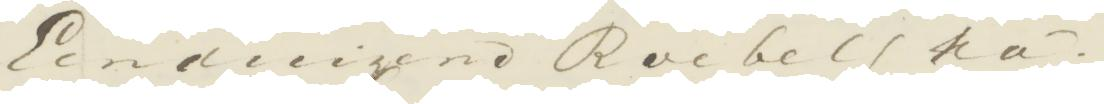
Een duizend Roebels ka„
